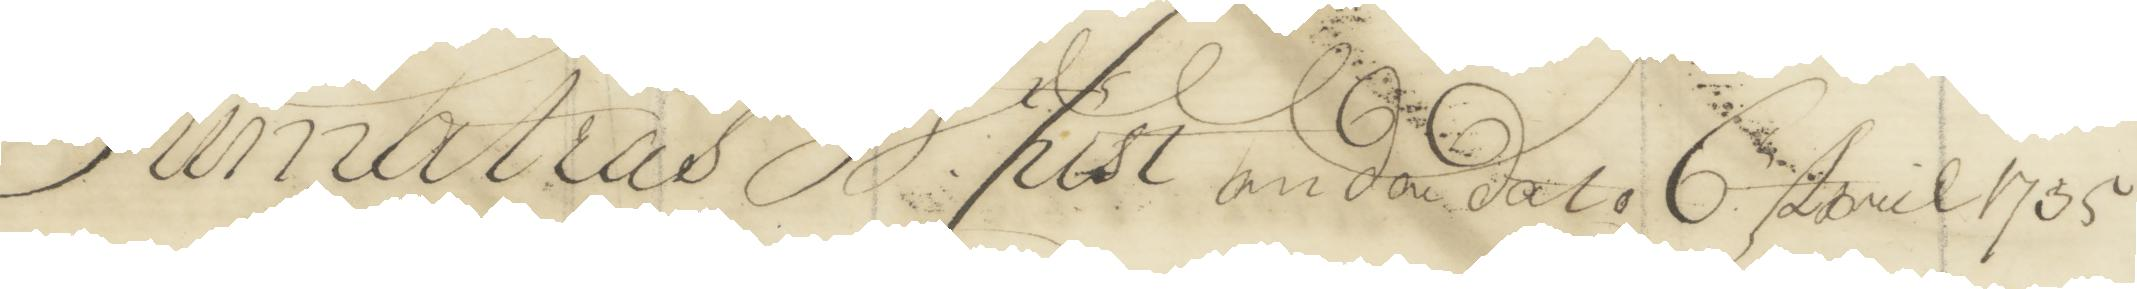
Sumatras W:t Cust onder dato 6: April 1735
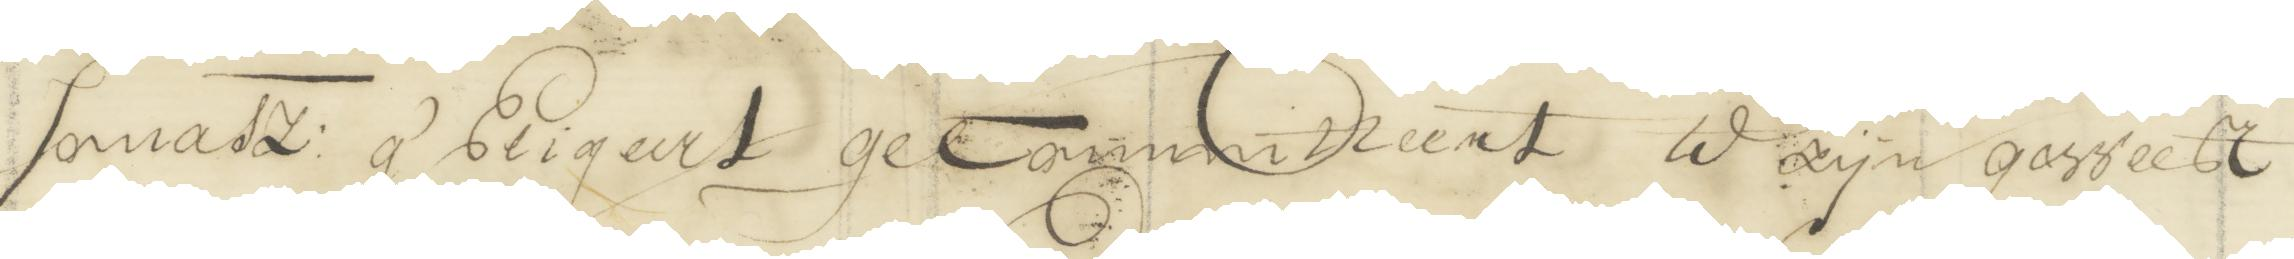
Jonasz: g’Eligeert gecommitteert te zijn geweest
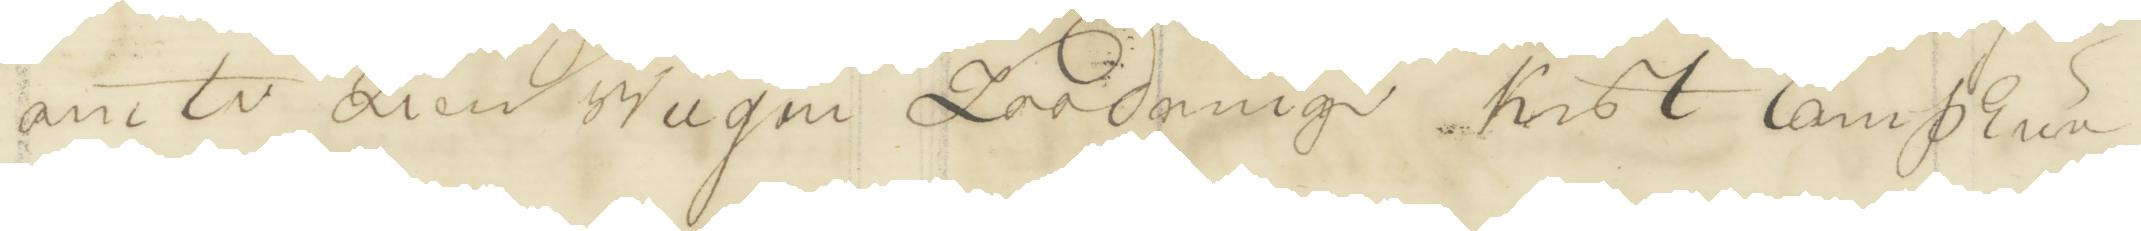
om te zien weegen zoodanige kist camphur
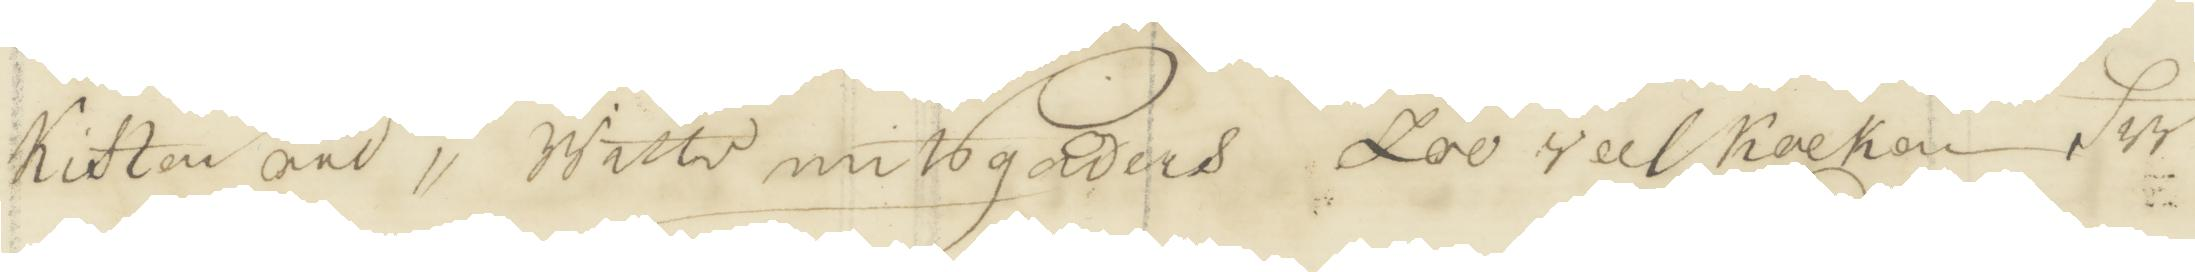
kisten ord„re witte mitsgaders zoo veel koeken tw:
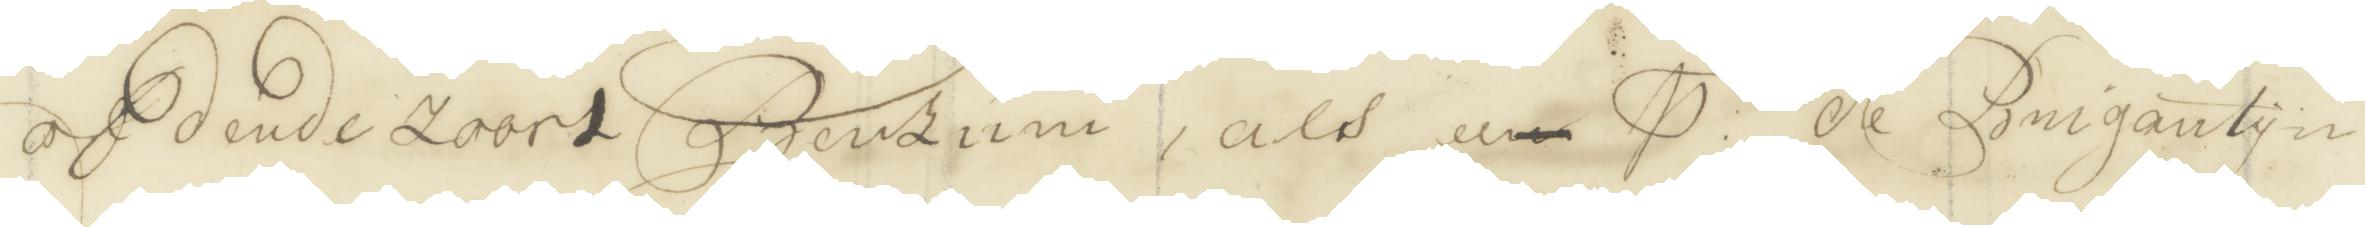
of derde zoort Benzuin, als een p:r de Brigantijn
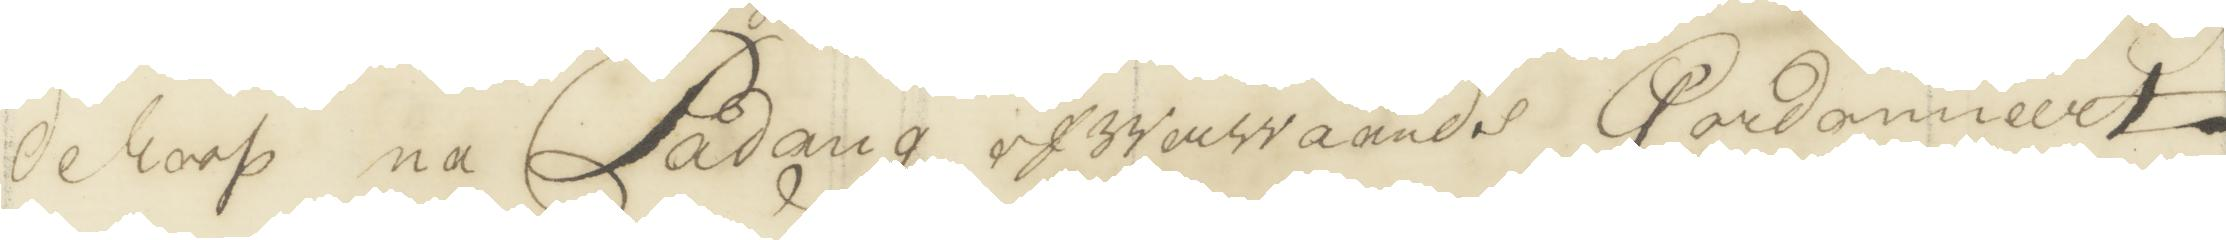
de hoop na Padang of werwaards G'ordonneert.
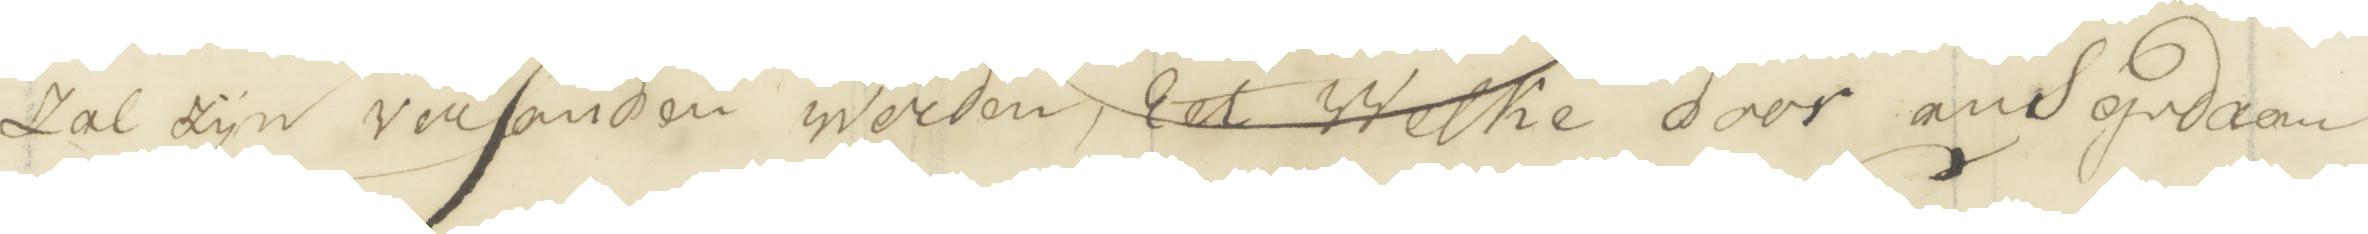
zal zijn versonden werden, het welke door ons gedaan
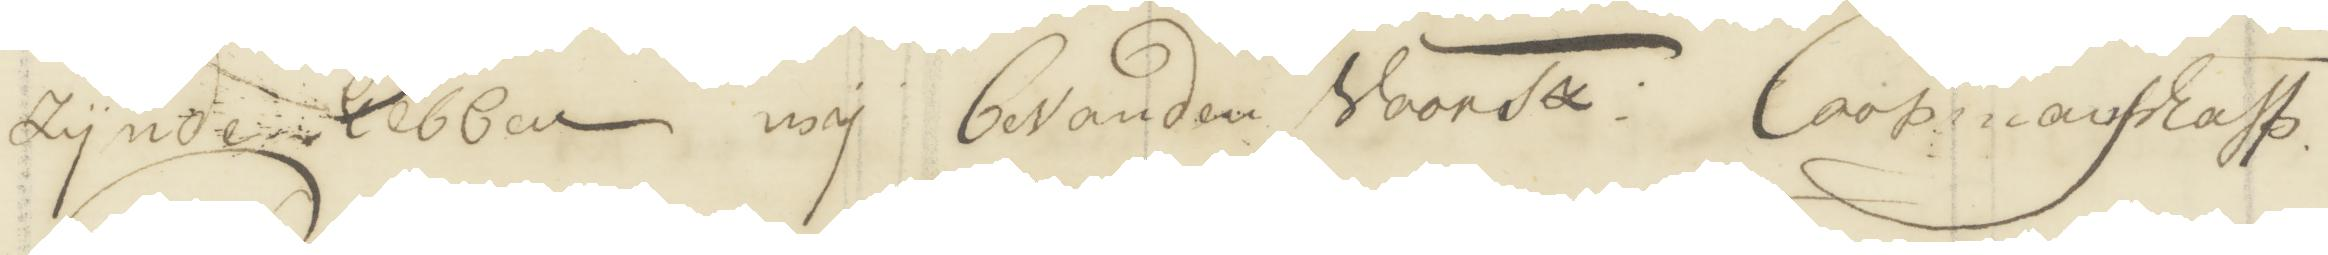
zijnde hebben wij bevonden voorsz: Coopmanschapp:
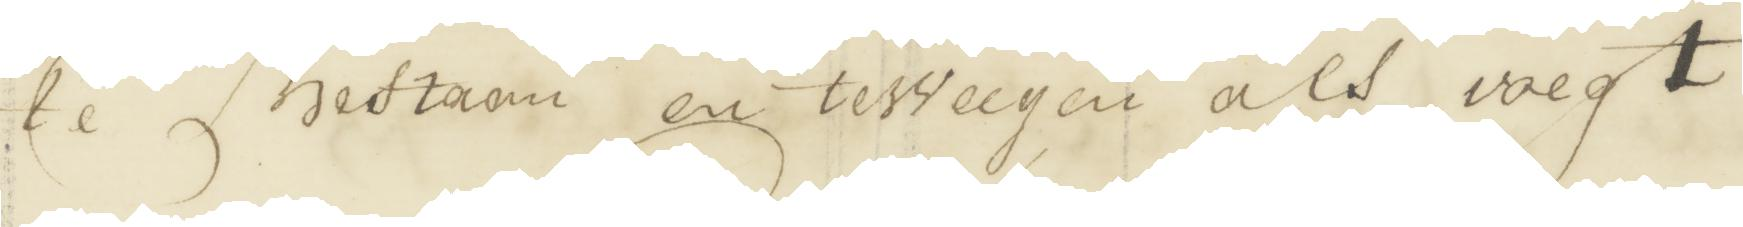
te Bestaan en teweegen als volgt
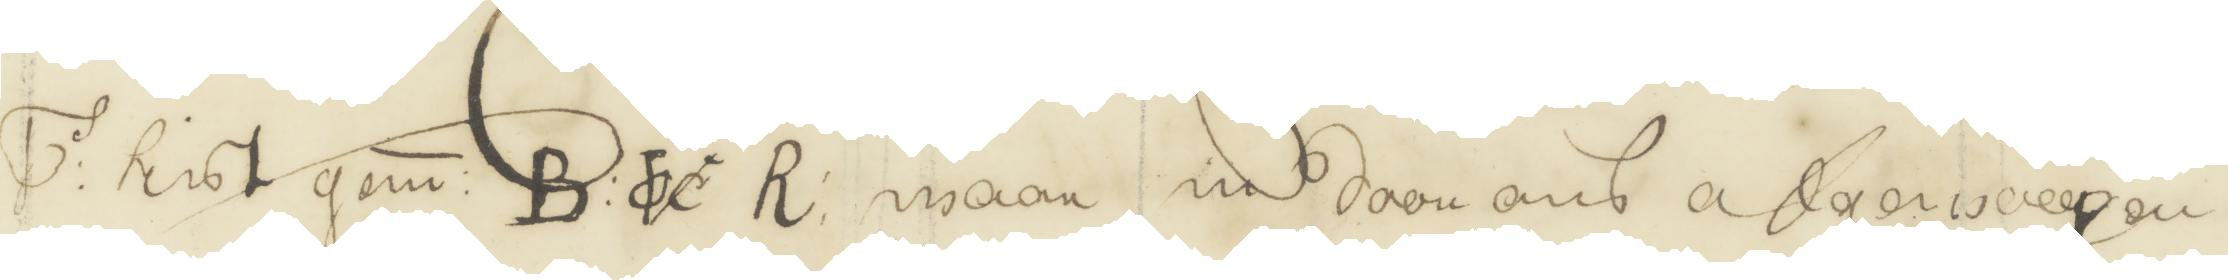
1:—:—. P:s kist gem: B: V: R: waar in door ons afgewoogen ,
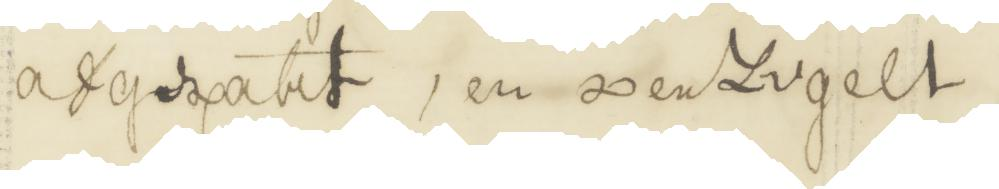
afgepakt, en verzegelt is,
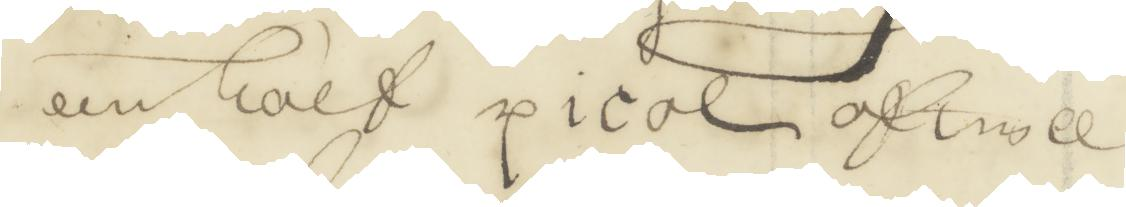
een half picol of twee
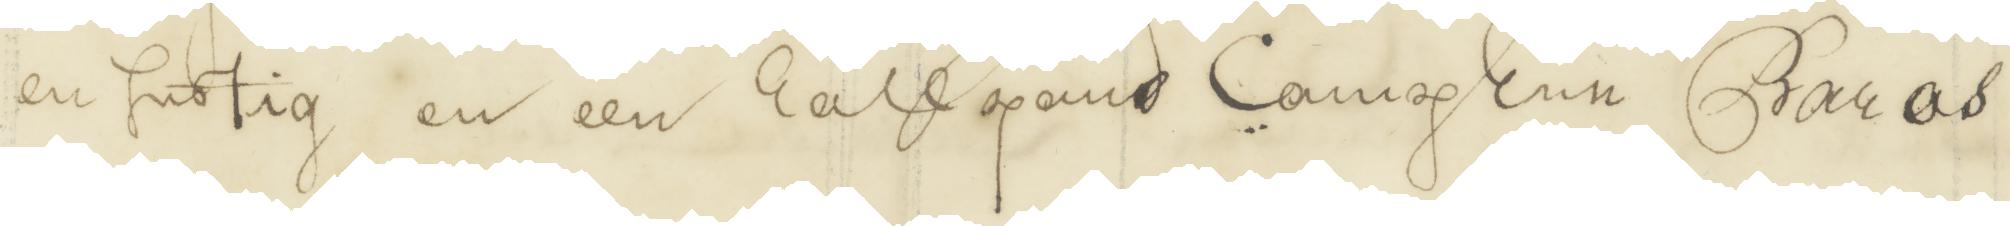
en sestig en een half pond Camphur Baros
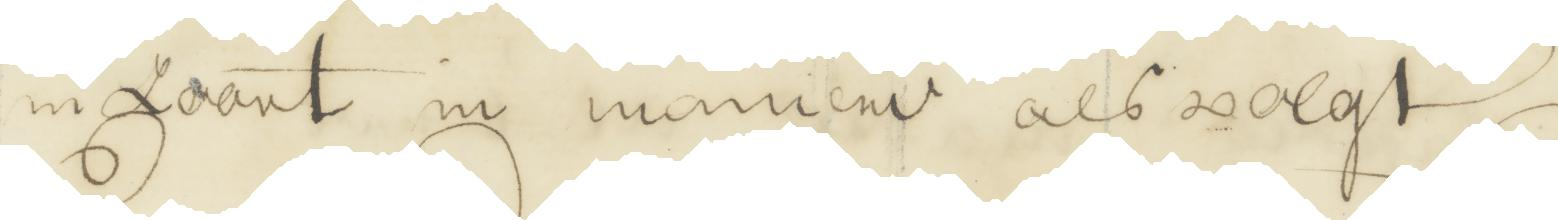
in zoort in maniere als volgt
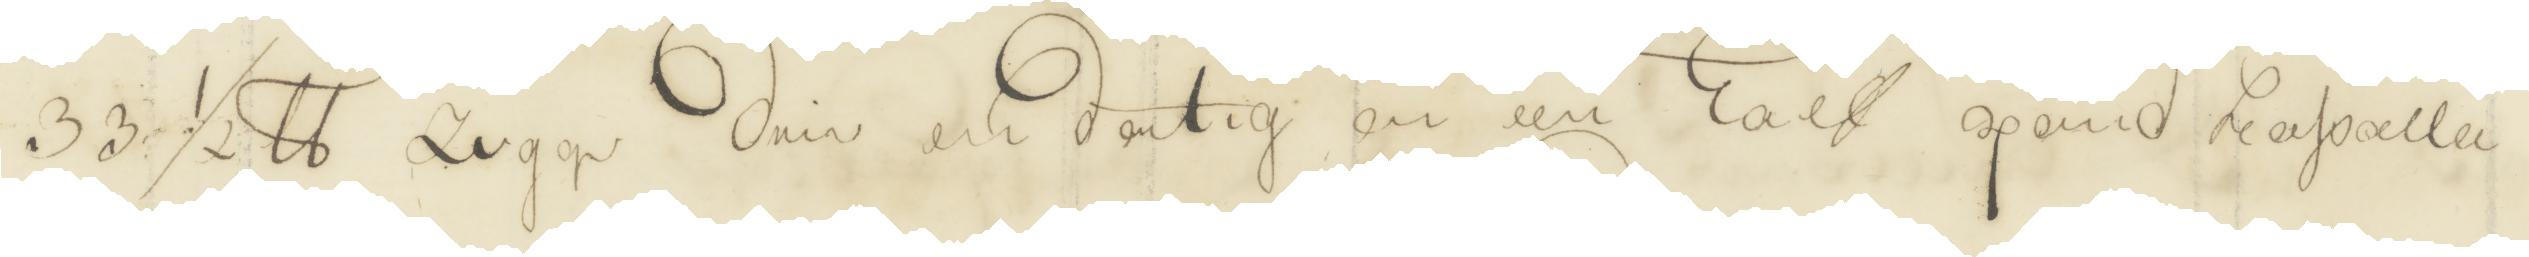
33:½ lb zegge drie en dertig en een half pond kappalla
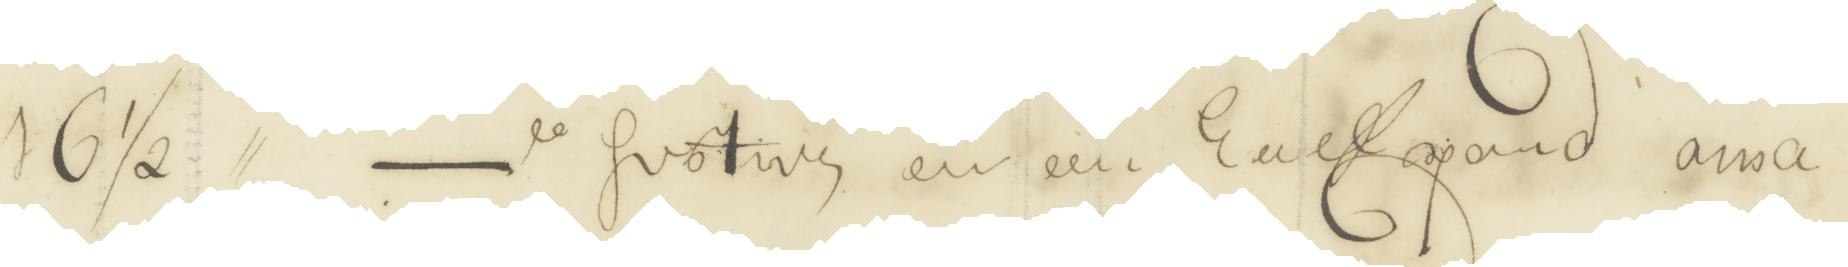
16½ „ _o sestien en een half pond awa
